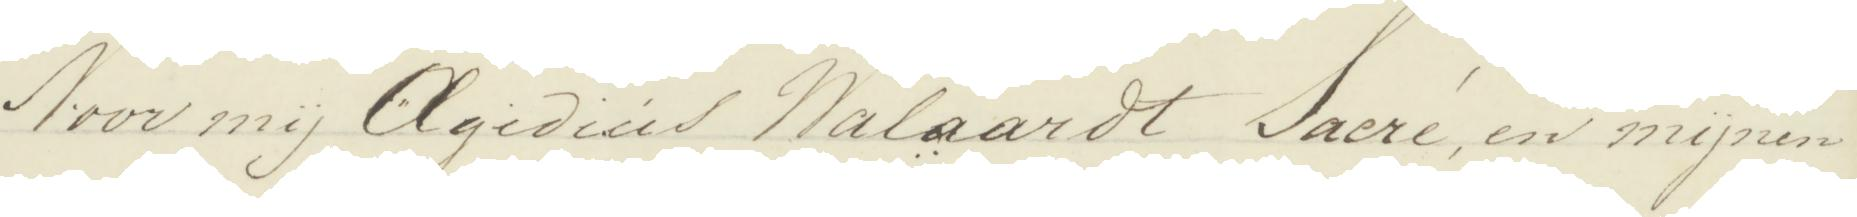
Voor mij AEgidius Walaardt Sacré, en mijnen
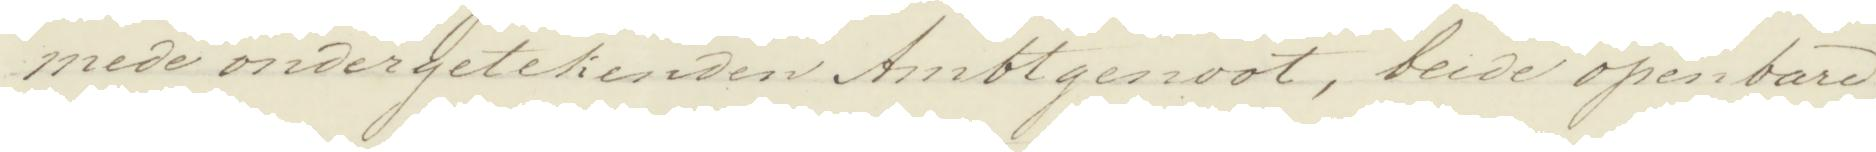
mede ondergetekenden Ambtgenoot, beide openbare
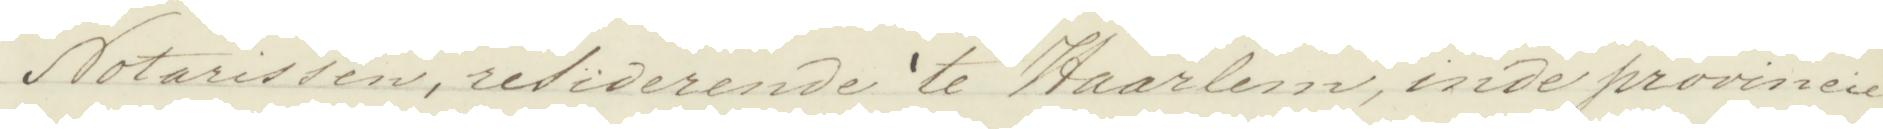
Notarissen, residerende 'te Haarlem, inde provincie
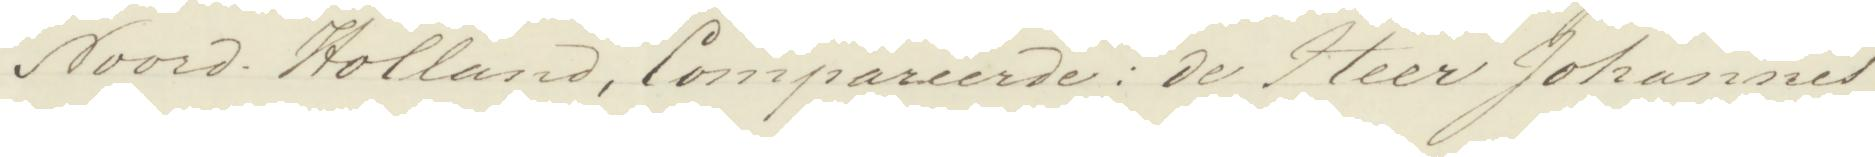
Noord-Holland, Compareerde: de Heer Johannes
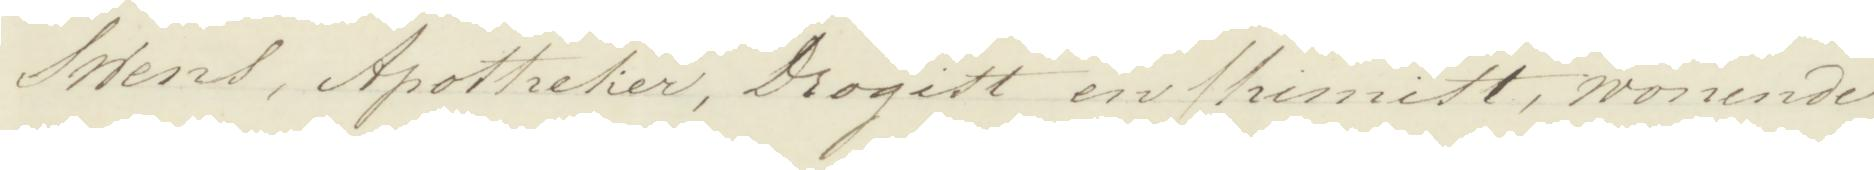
Swens, Apotheker, Drogist en Chimist, wonende
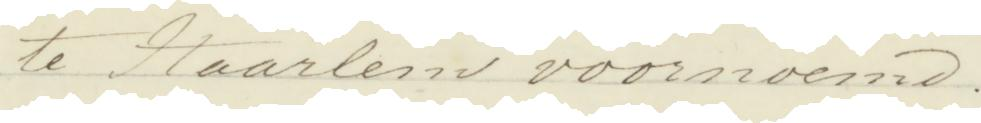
te Haarlem voornoemd
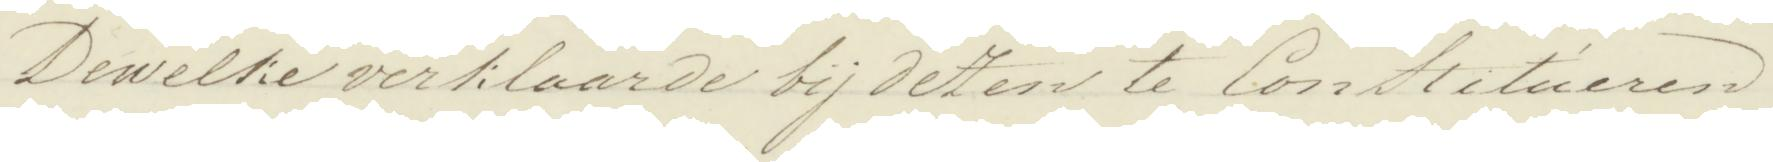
Dewelke verklaarde bij dezen te Constitueren
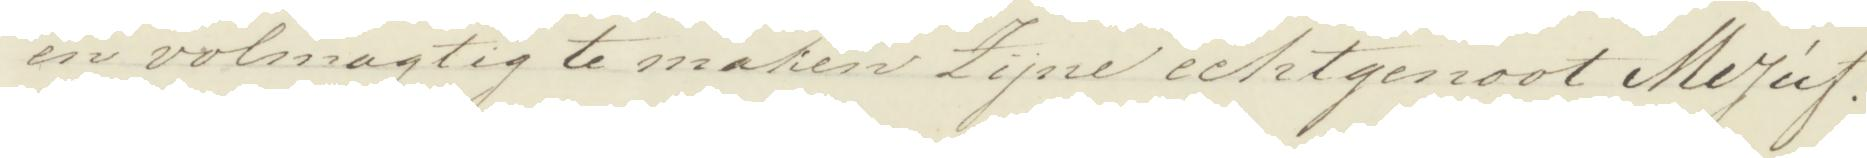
en volmagtig te maken zijne echtgenoot Mejuf„
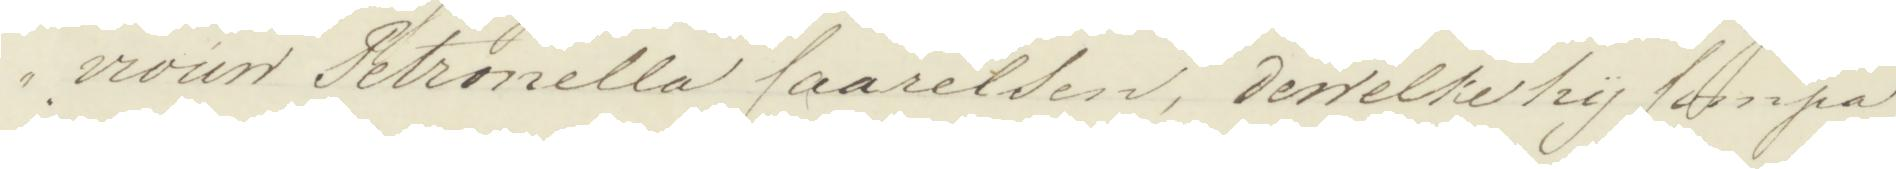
„vrouw Petronella Caarelsen, dewelke hij Compa
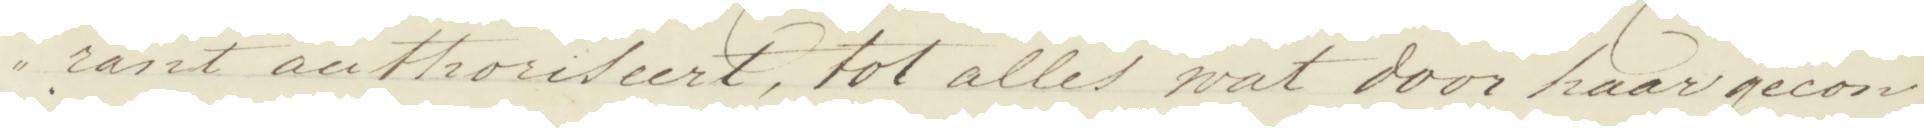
„rant authoriseert, tot alles wat door haar gecon
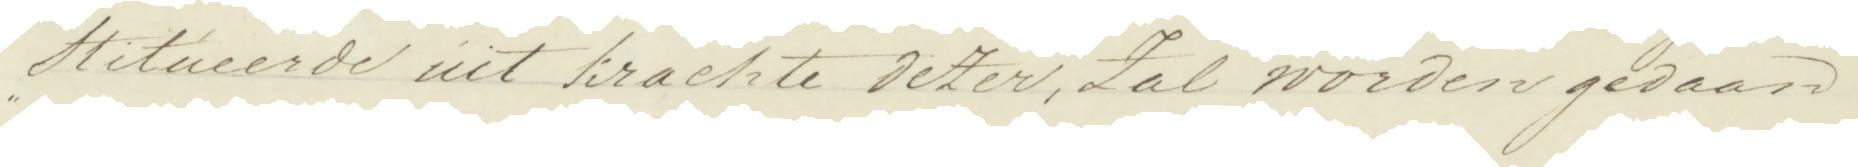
„stitueerde uit krachte dezer, zal worden gedaan
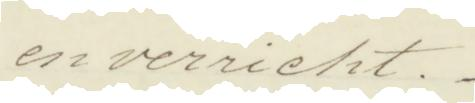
en verricht.
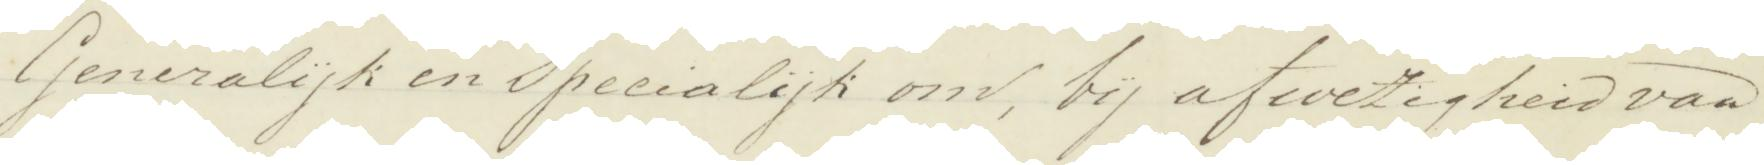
Generalijk en Specialijk om, bij afwezigheid van
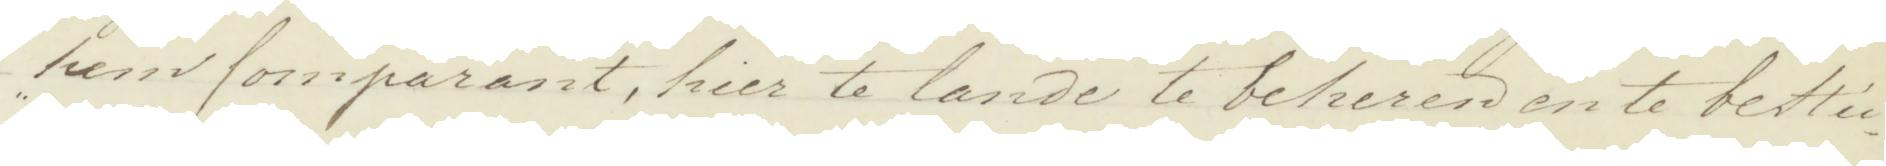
„hem Comparant, hier te lande te beheren en te bestie„
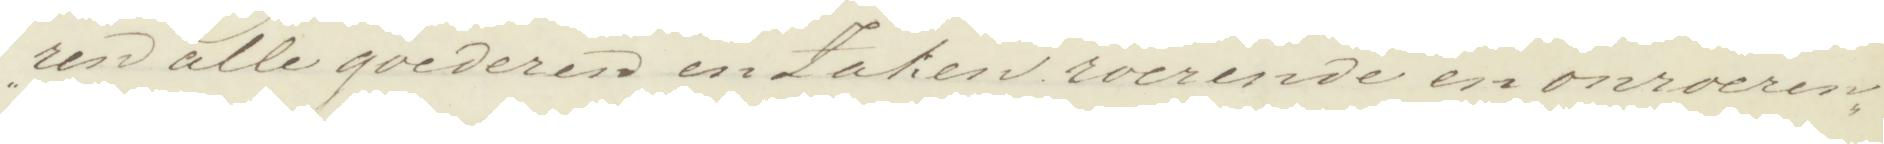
„ren alle goederen en zaken roerende en onroeren„
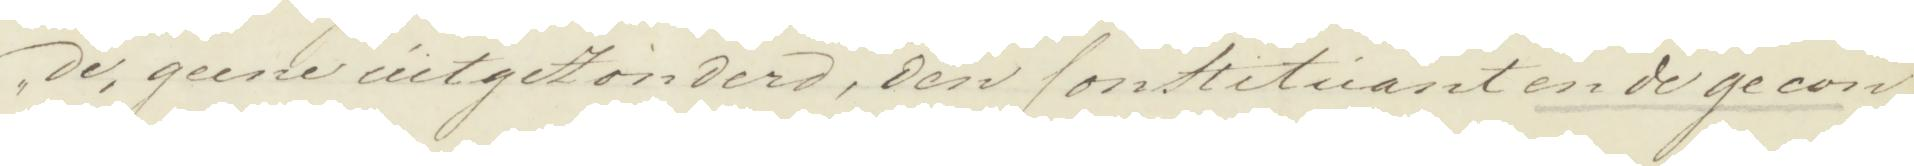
„de, geene uitgezonderd, den Constituant en de gecon
